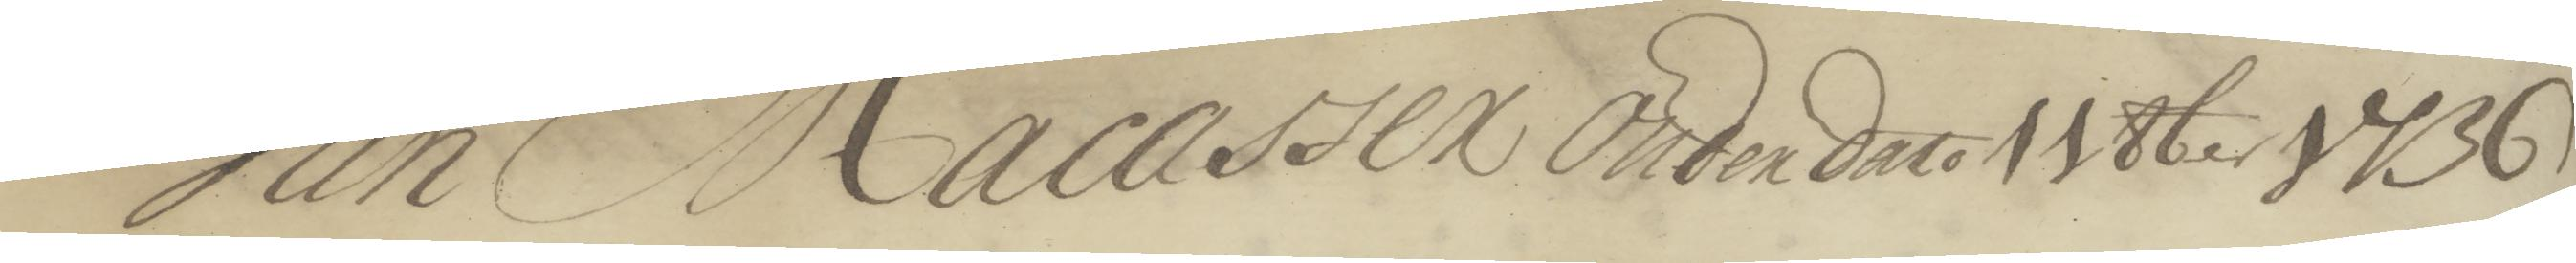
Van Macasser Onder dato 11 8ber 1736
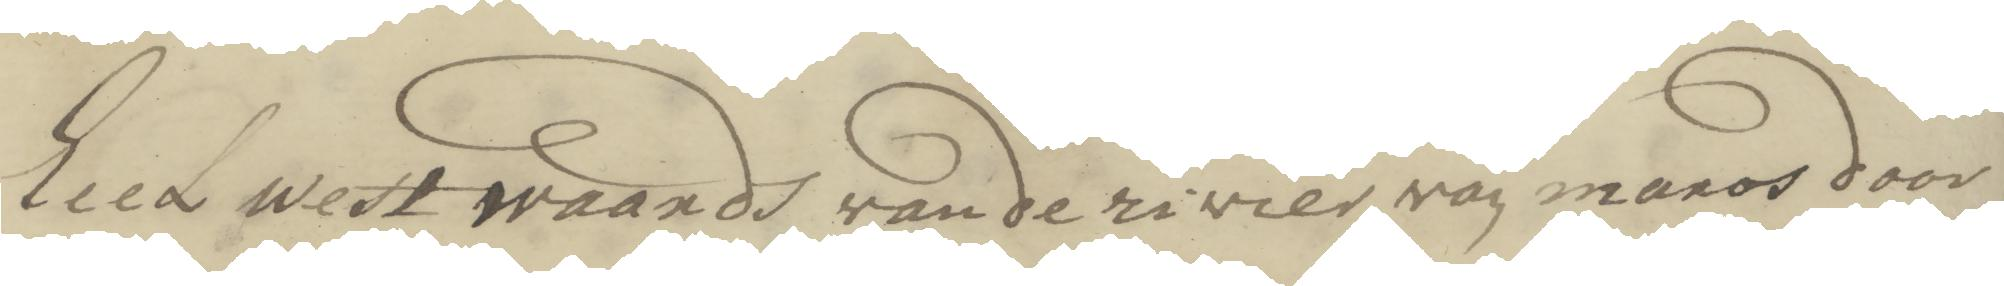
heel west waards van de rivier van maros door
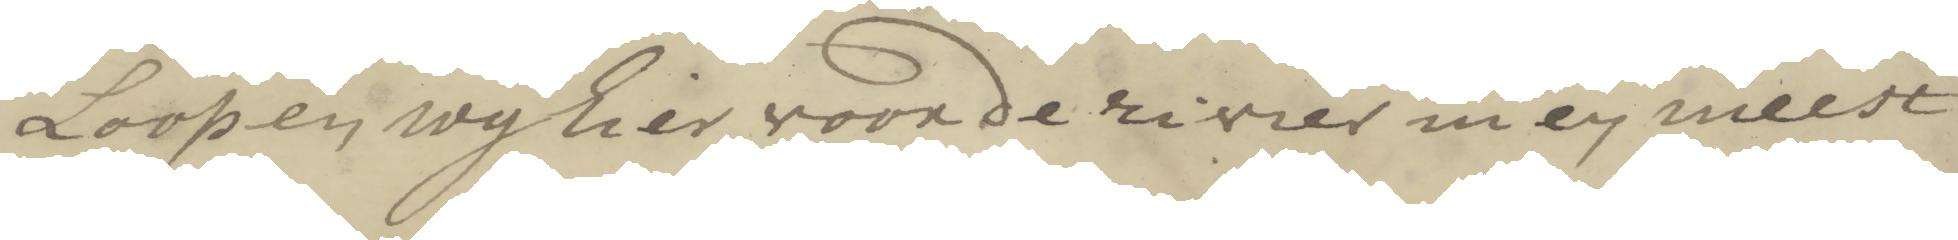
loopen wy hier voor de rivier in en meest
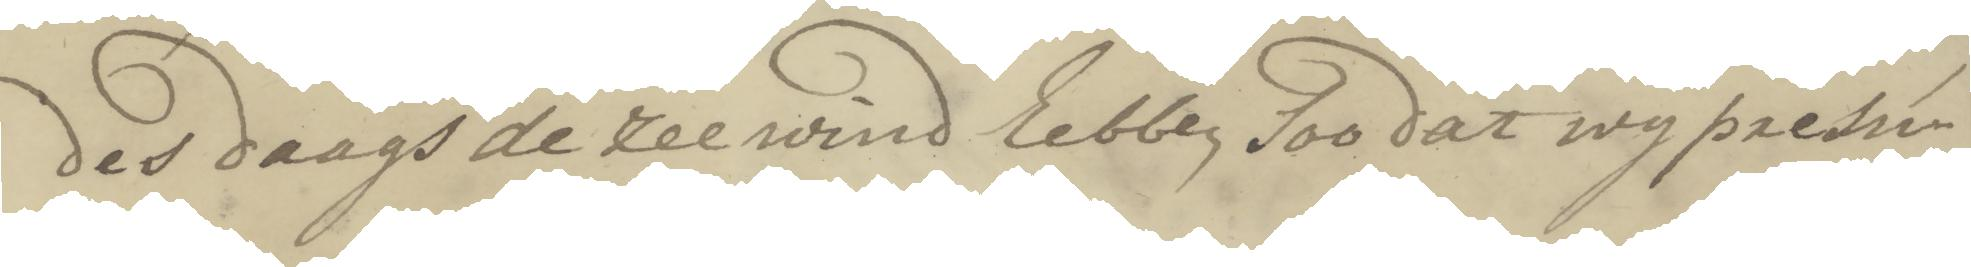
des daags de zee wind hebben soo dat wy presu
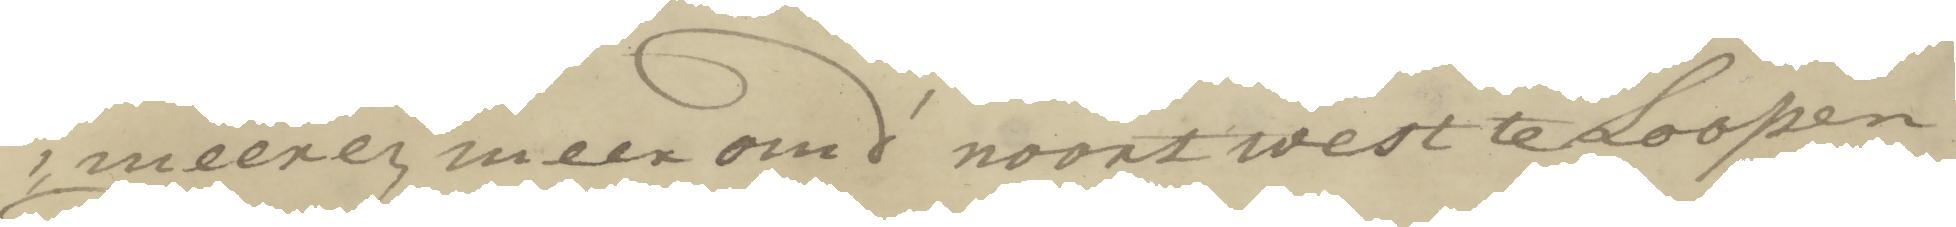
meeren meer om d' noort west te Loopen
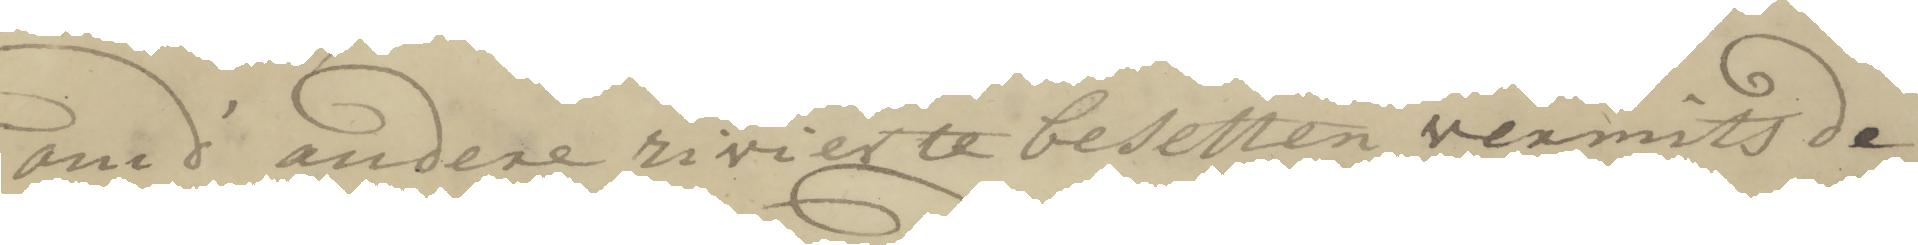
om d' andere rivier te besetten vermits de
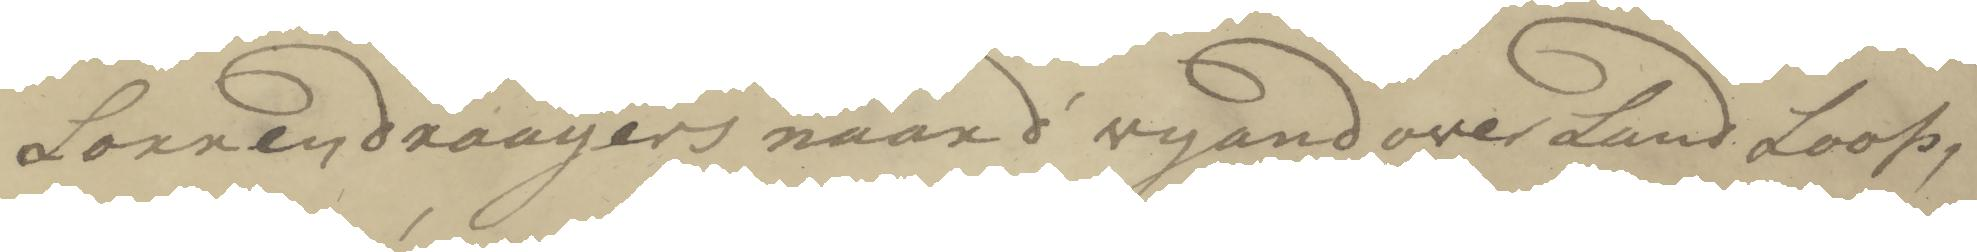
lorren draaijers naar d’ vyand over land loop,
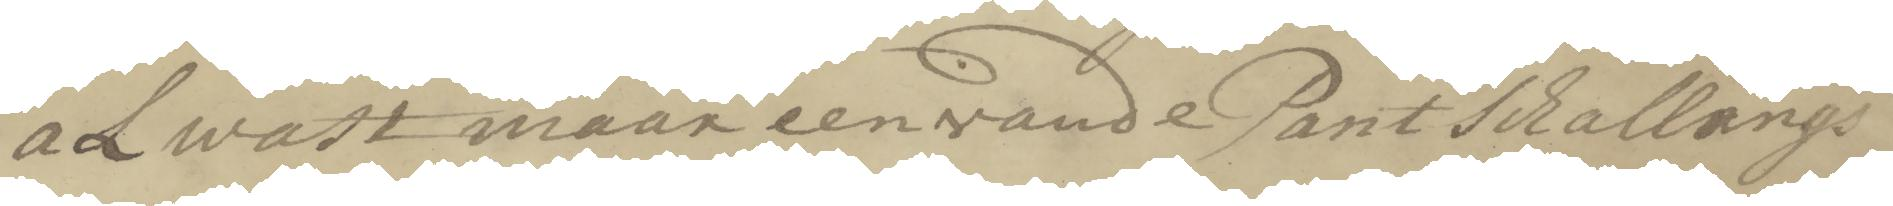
al was't maar een vande Pantschallangs
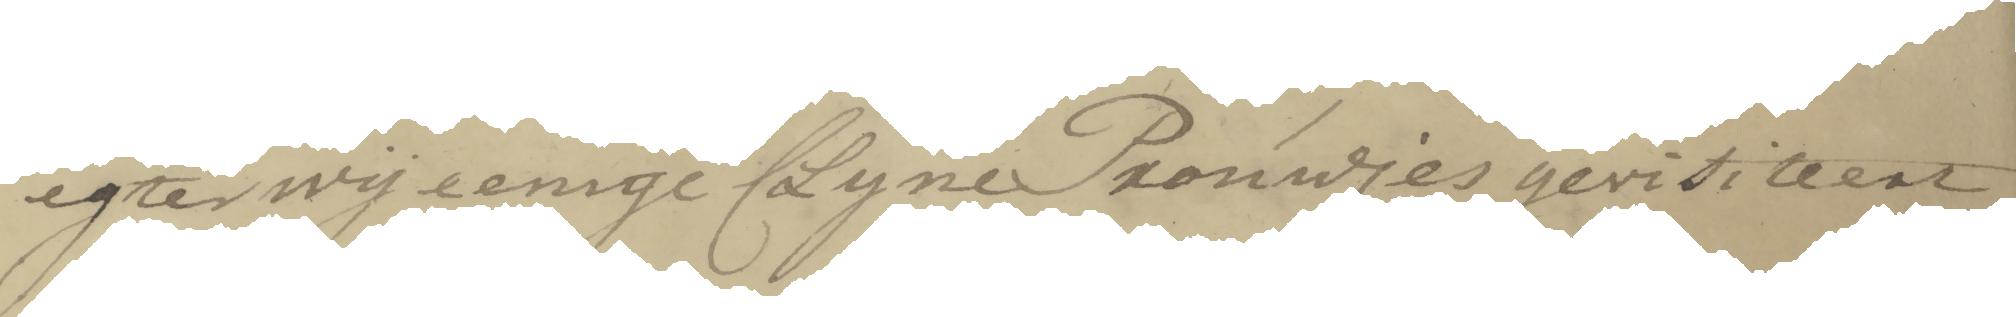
egter wij eenige Clyne Prouwjes gevisiteert
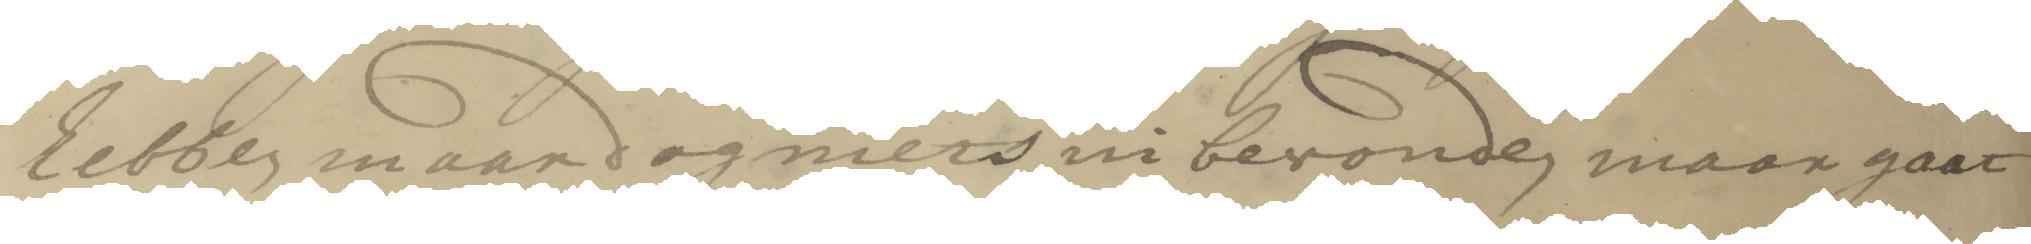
hebben maar dog niets in bevonden maar gaat
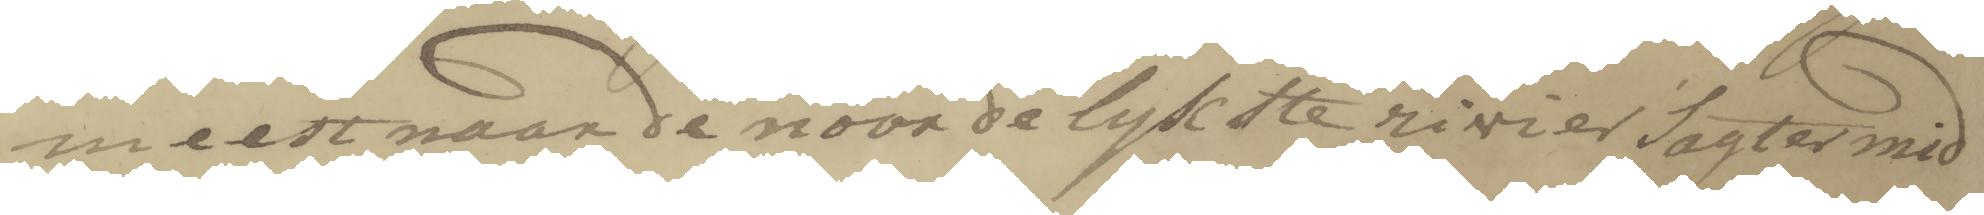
meest naar de noordelykste rivier 's agter mid
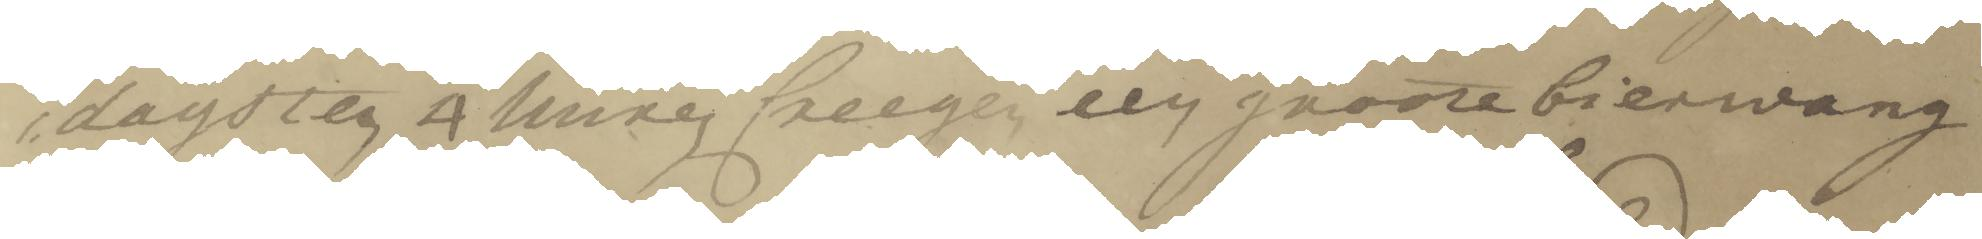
„dags ten 4 uuren Creegen een groote bierwang
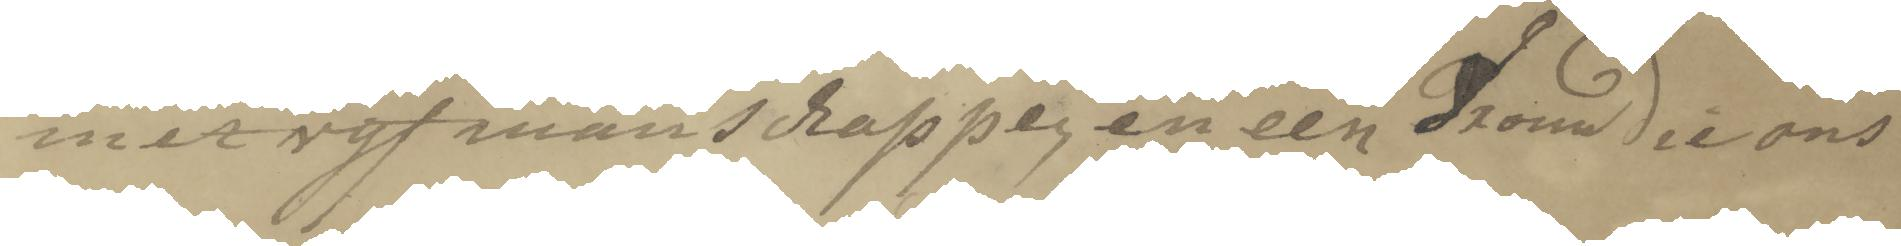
met vyf manschappen en een vrouw die ons
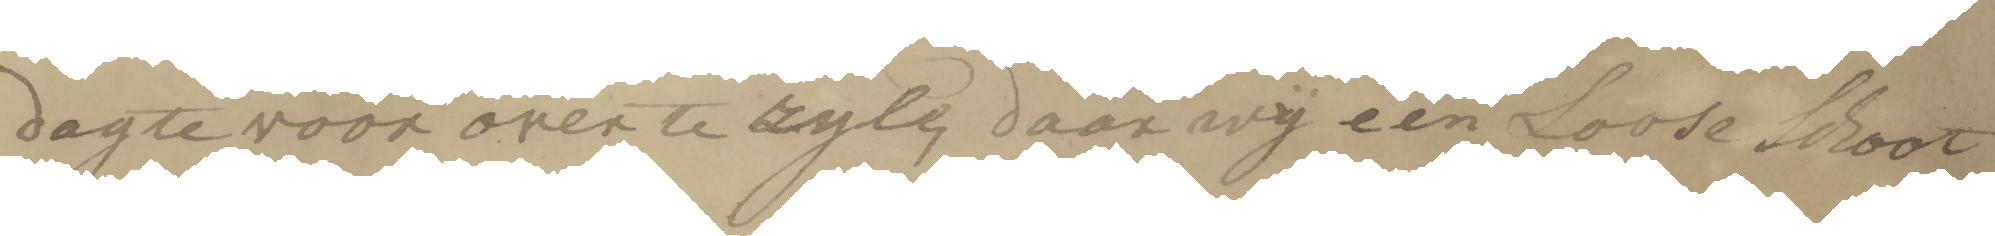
dagte voor over te zylen daar wij een loose schoot
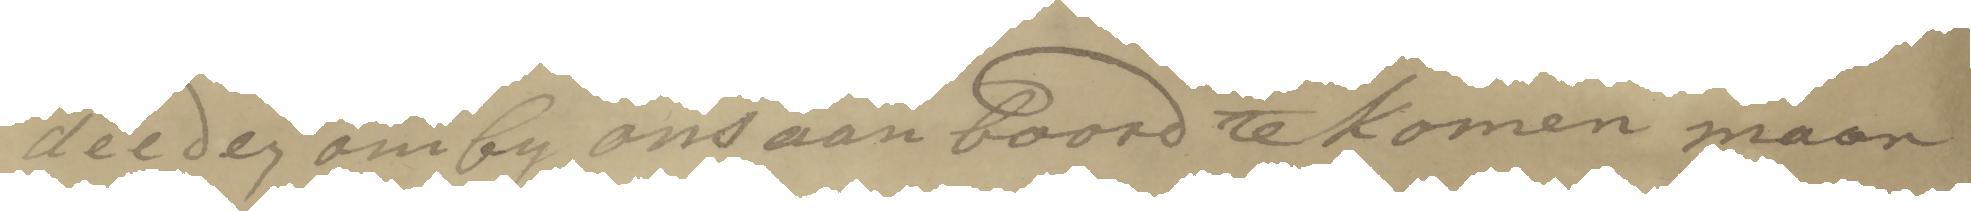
deeden om by ons aan boord te komen maar
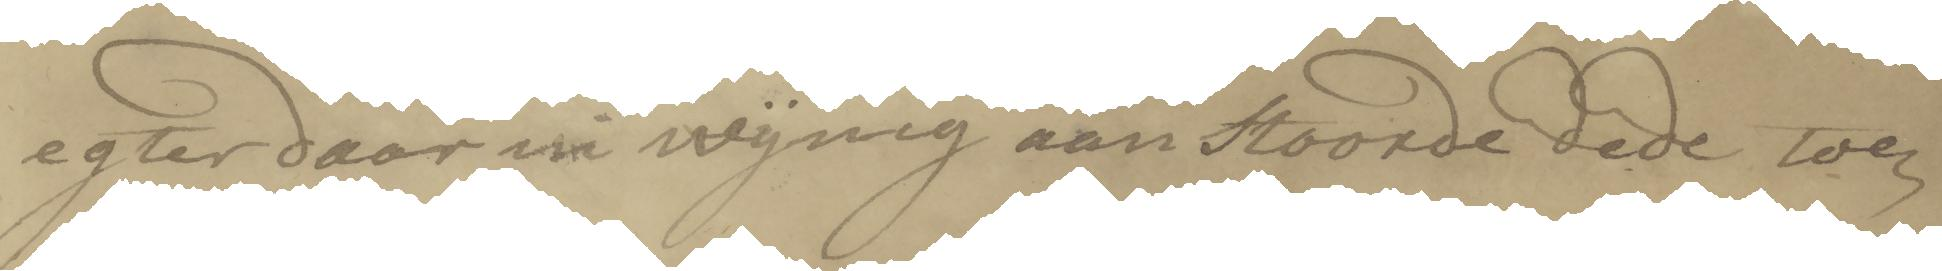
egter daar in wijnig aan stoorde dede toen
